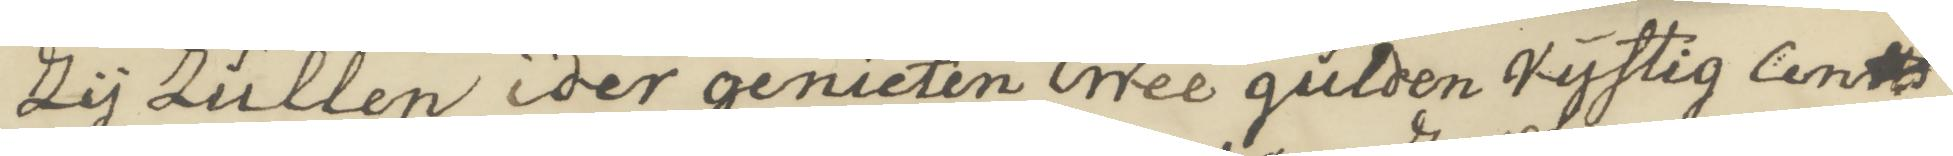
zij zullen ider genieten twee gulden vijftig Cents
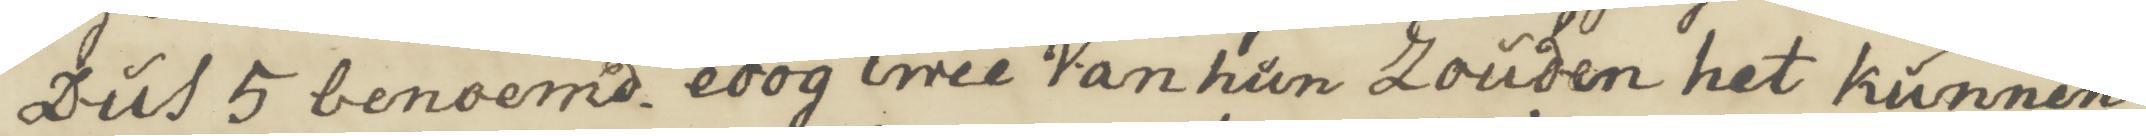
Dus 5 benoemd edog twee van hun zouden het kunnen
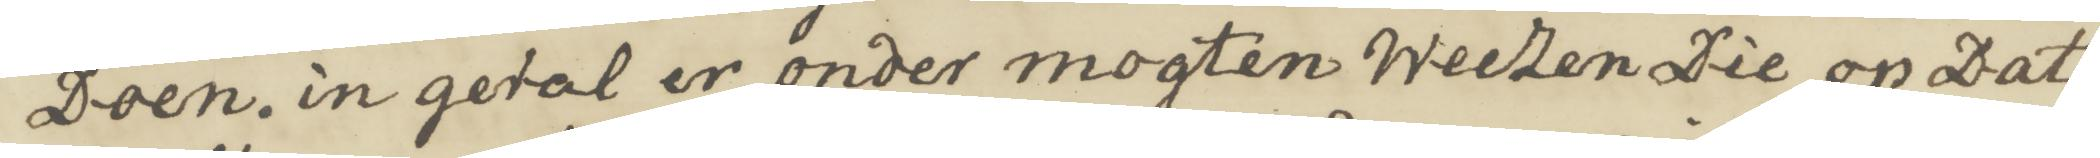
Doen, in geval er onder mogten weezen Die op Dat
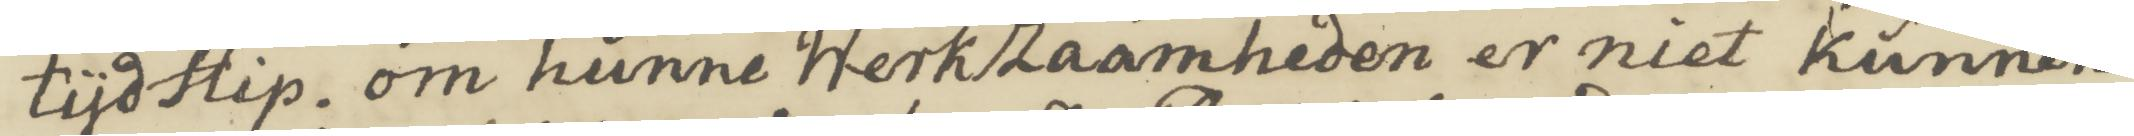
tijdstip. om hunne werkzaamheden er niet kunnen
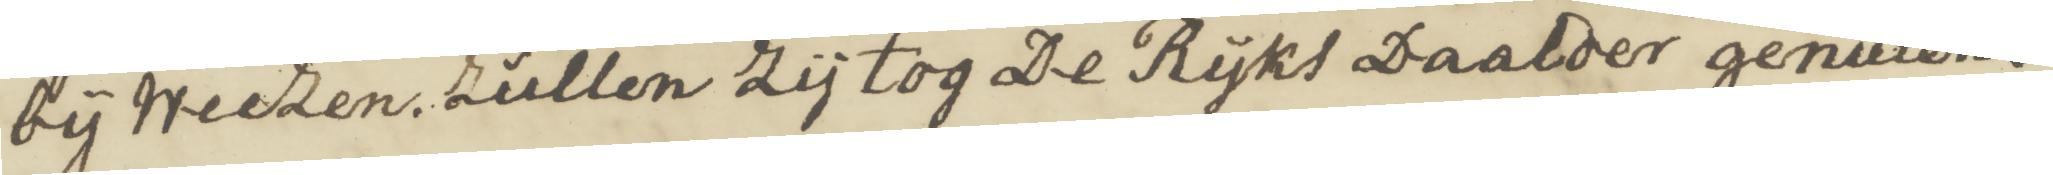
bij weezen, zullen zij tog De Rijks Daalder genieten.
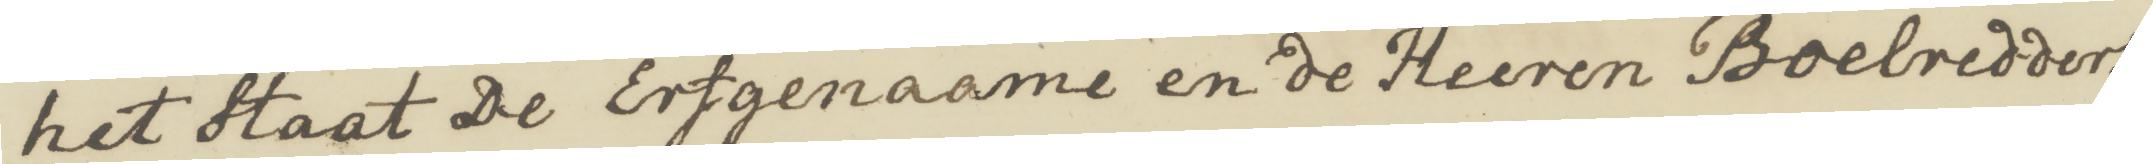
het staat De Erfgenaame en de Heeren Boelredders
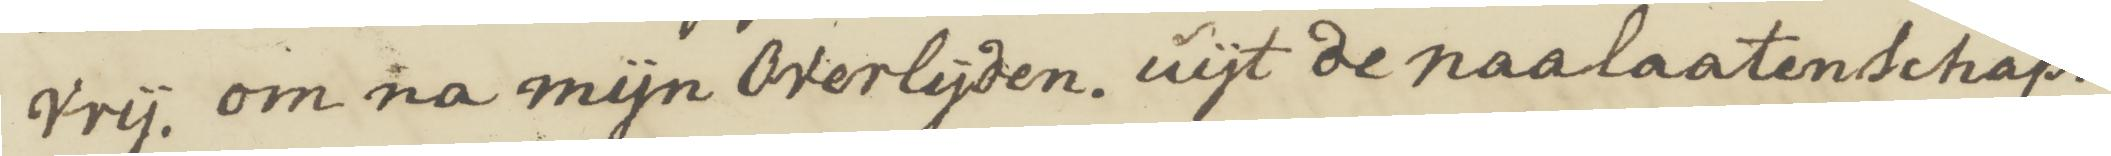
vrij, om na mijn Overlijden, uijt de naalaatenschap.
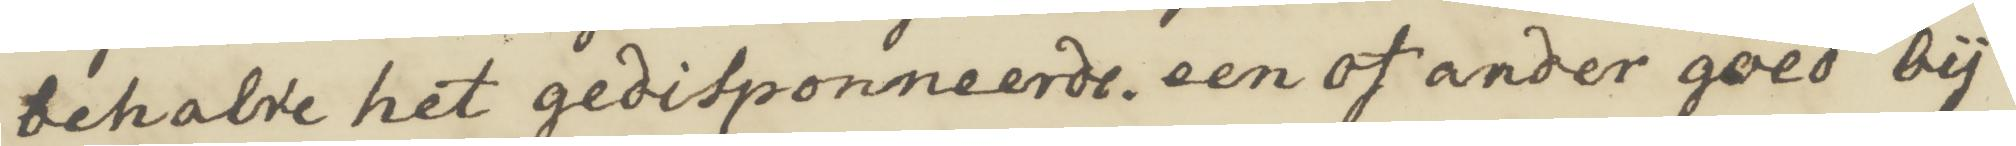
behalve het gedisponneerde, een of ander goed bij
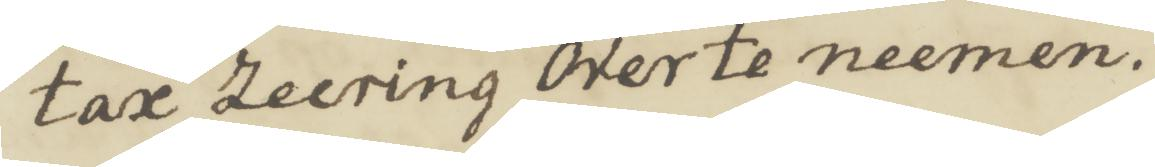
tax zeering Over te neemen.
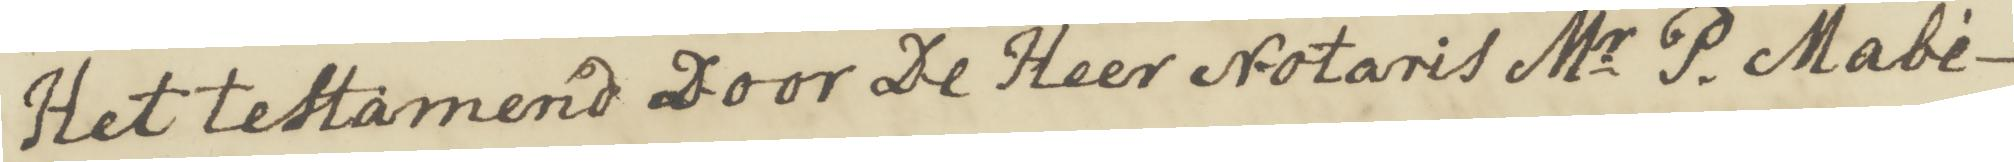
Het testamend Door De Heer Notaris M=r P. Mabé-
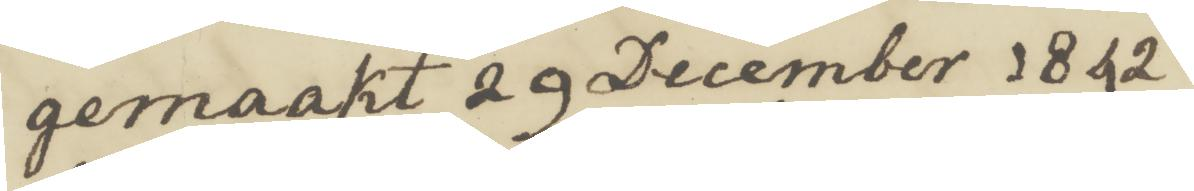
gemaakt 29 December 1842.
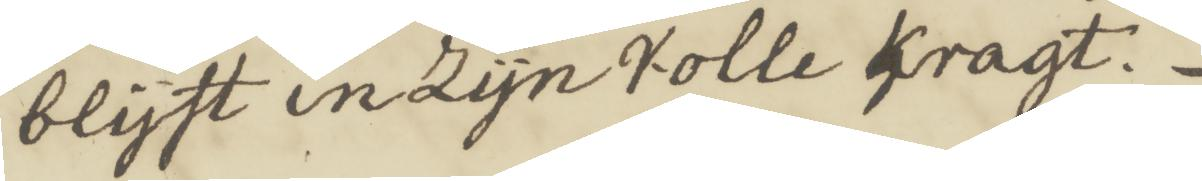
blijft in zijn volle kragt.
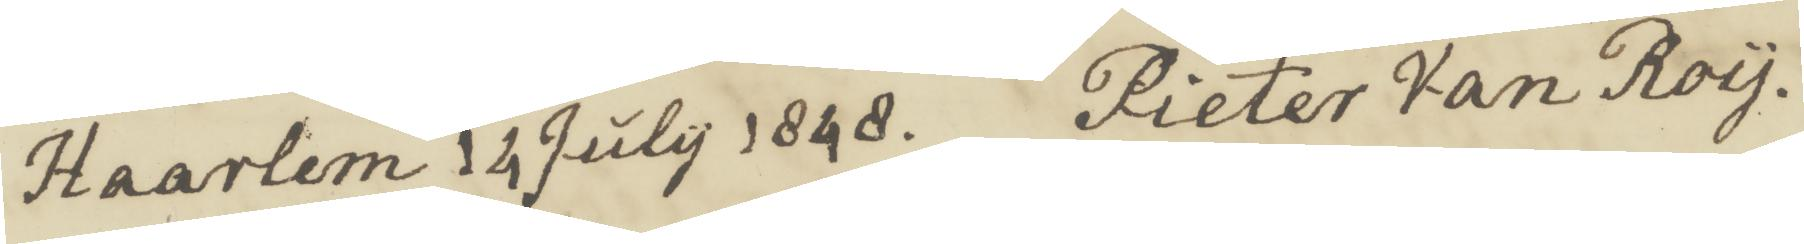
Haarlem 14 Julij 1848. Pieter van Roij.
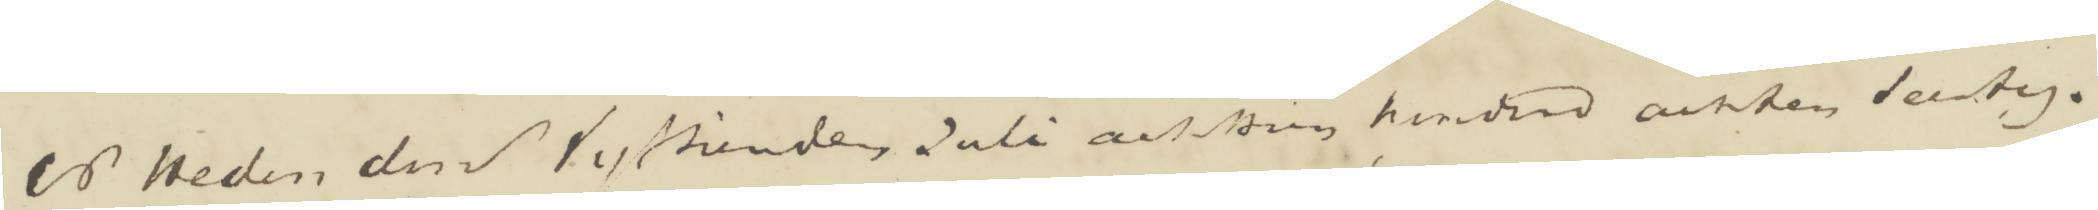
Is Heden den Vyftienden Iuli achttien honderd achten Veertig.
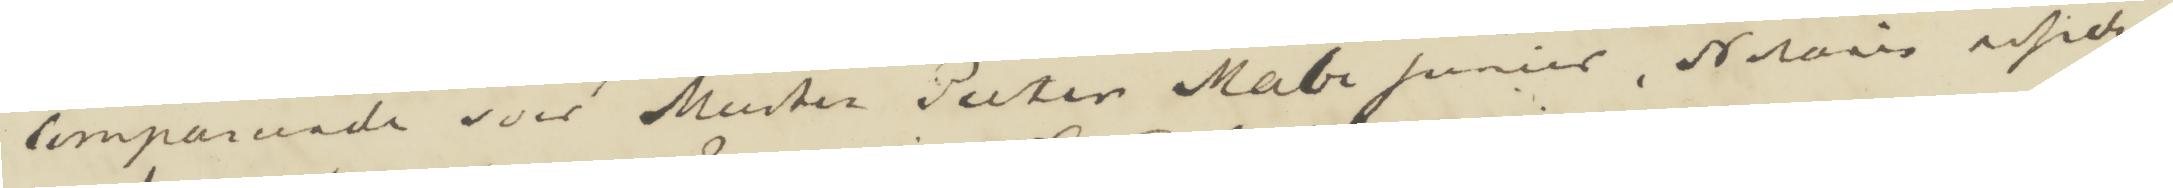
Compareerde voor Meester Pieter Mabé Junior Notaris reside
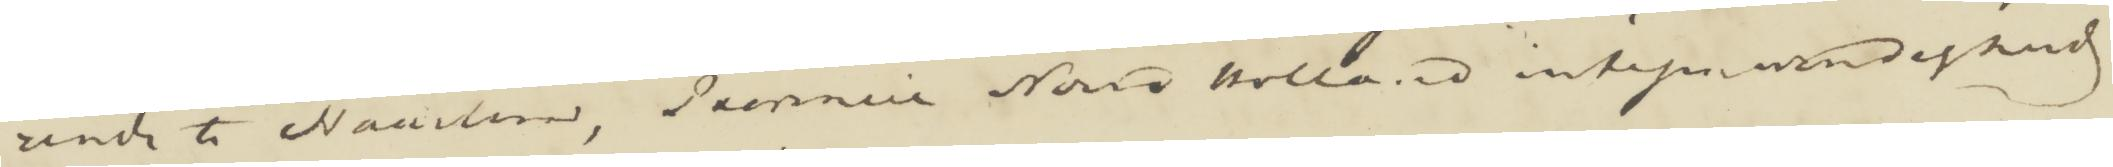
rende te Haarlem, Provincie Noord Holland integenwoordigheid
